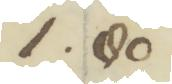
1. 80
